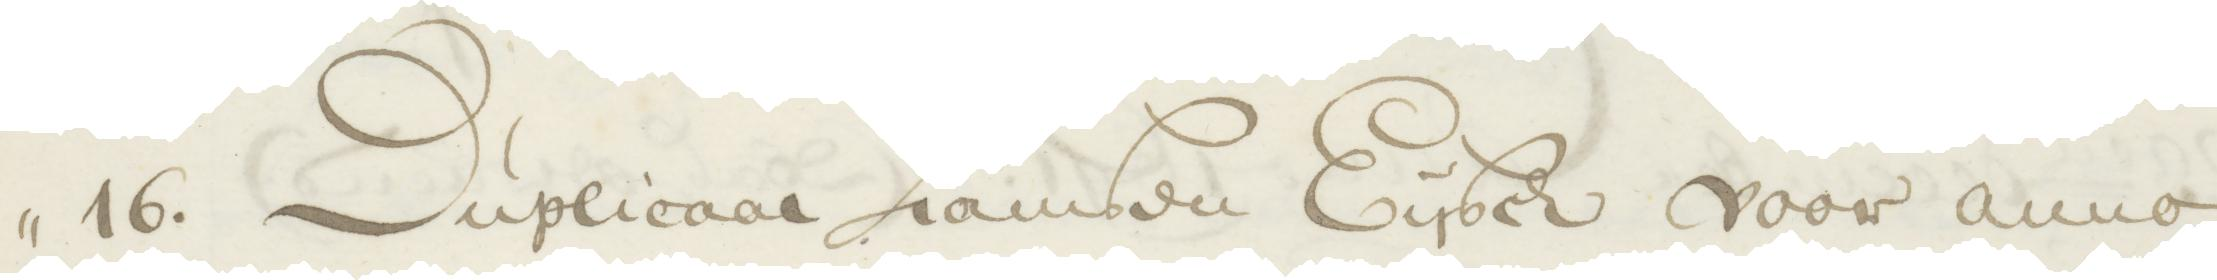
„16. Duplicaat siamsen Eijsch voor anno
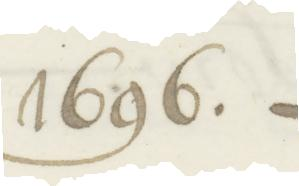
1696.
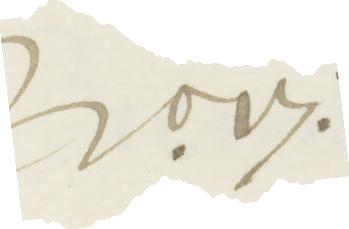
N.o 17.
